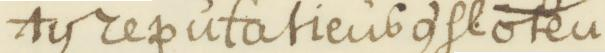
ty reputatieus g'sloten
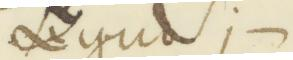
zijnde; –
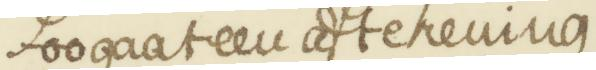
soo gaat een aftekening
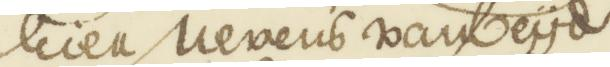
hier nevens van beijde
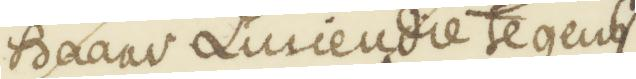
haare Linien die tegens
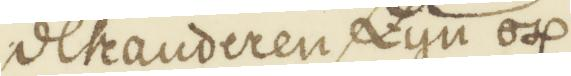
elkanderen zijn op
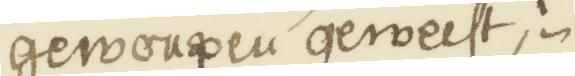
geworpen geweest, –
